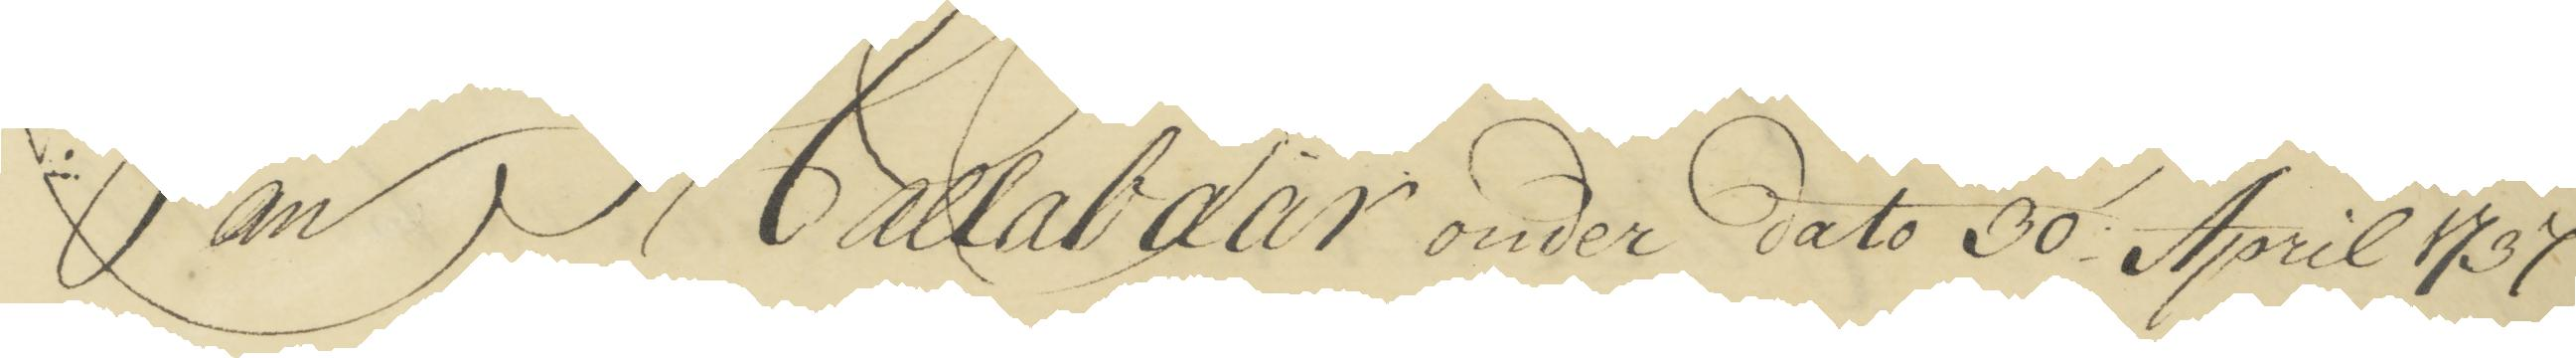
Van Mallabaar onder dato 30:' April 1737
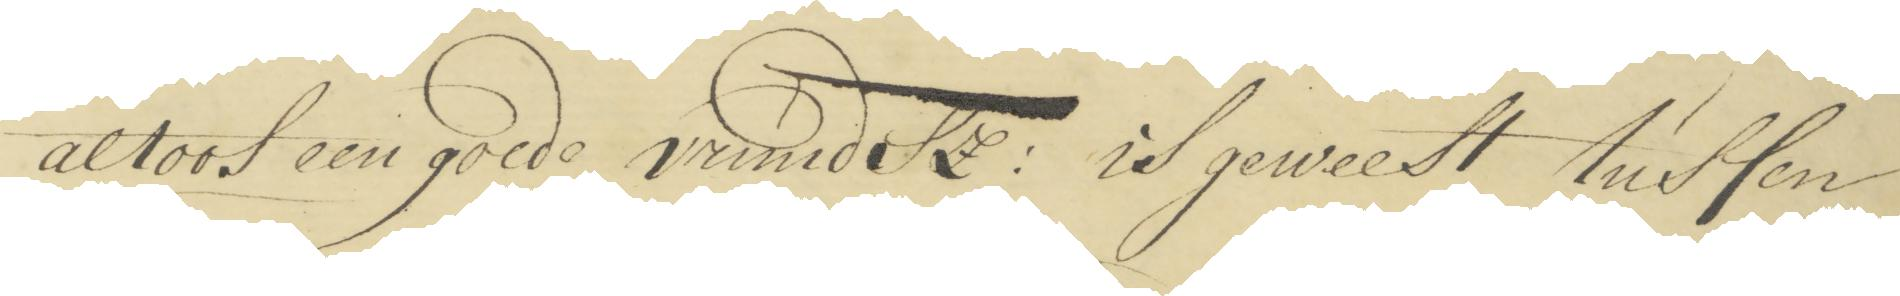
altoos en goede vrundsz: is geweest tussen
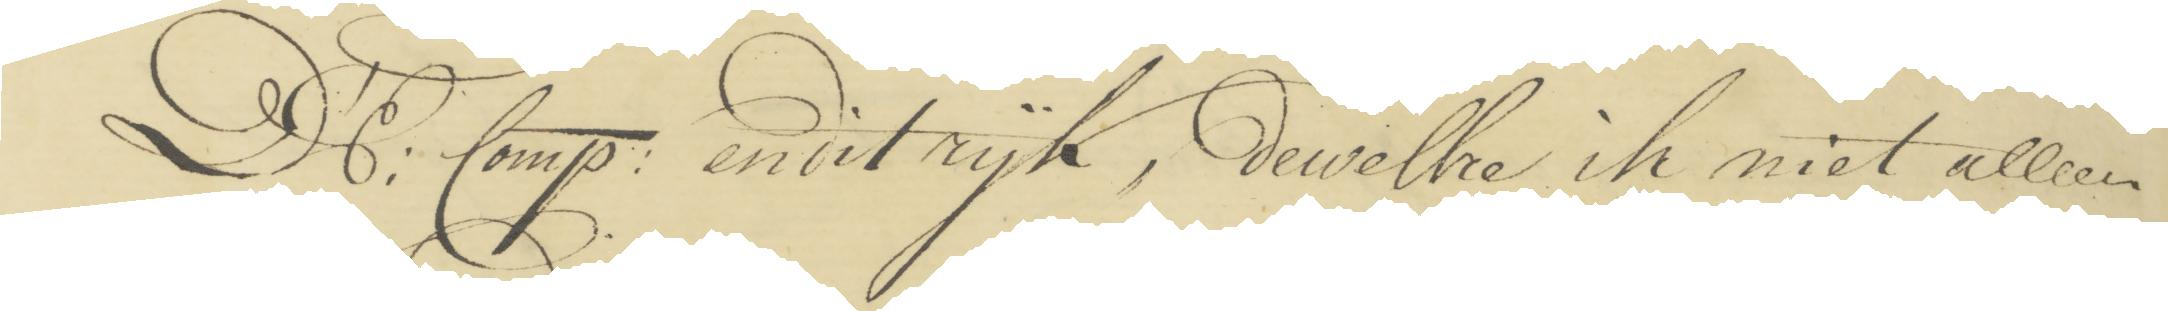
D' E: Comp: en dit rijk, dewelke ik niet alleen
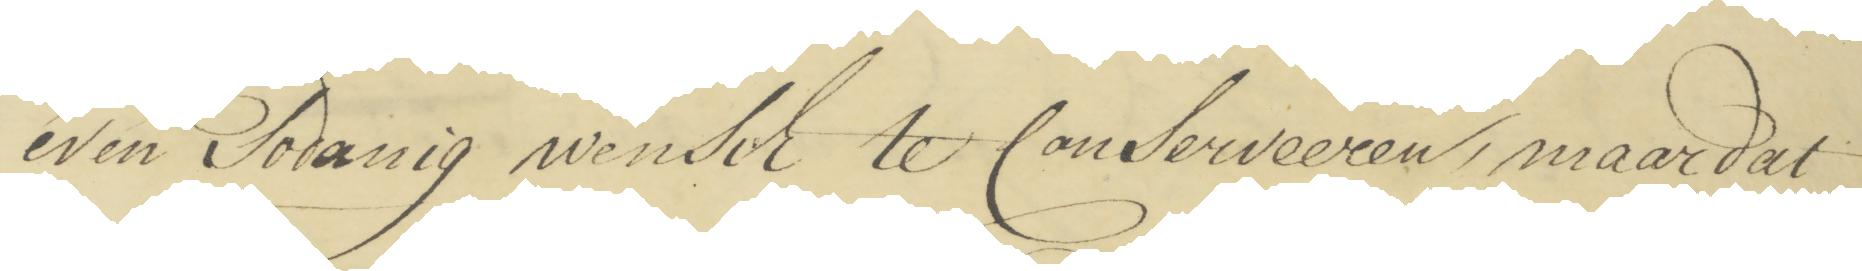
even sodanig wensch te Conserveeren, maar dat
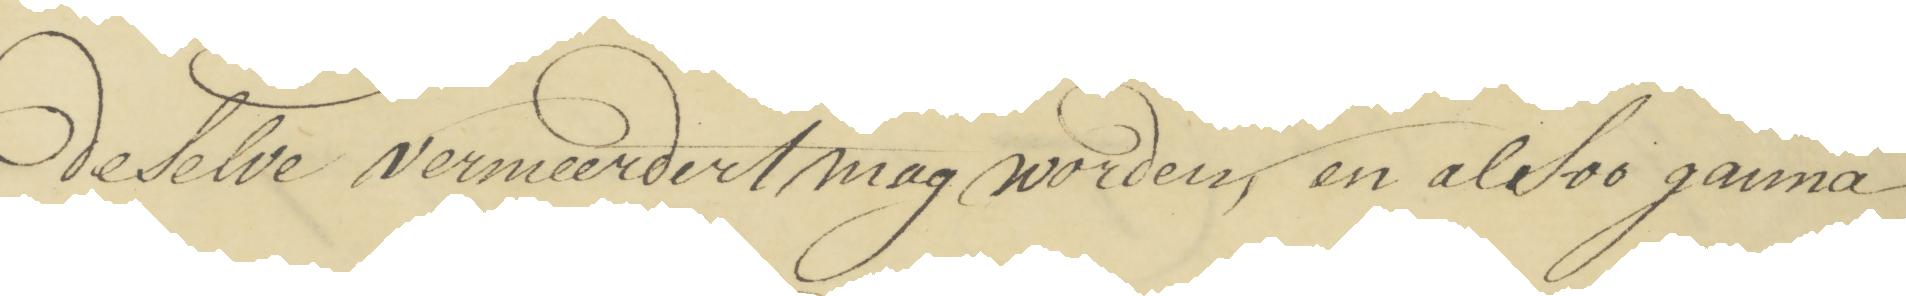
deselve vermeerdert mag worden, en alsoo ganna
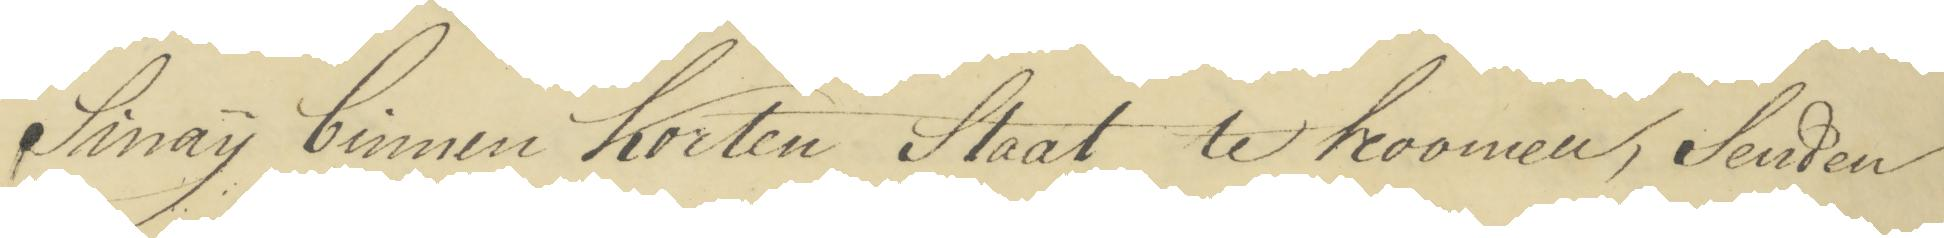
Sinaij binnen korten staat te koomen, senden
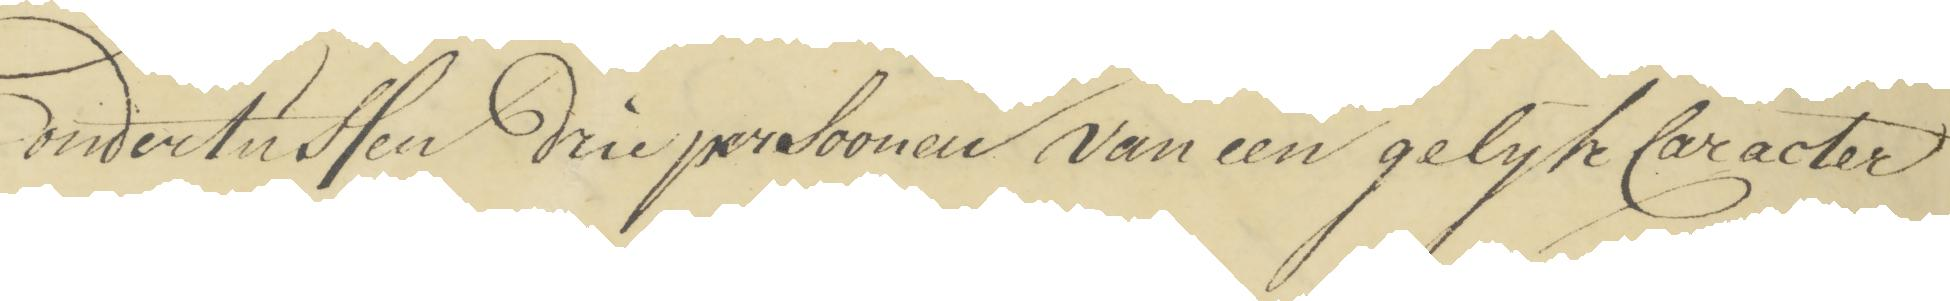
ondertussen drie persoonen van een gelijk Caracter
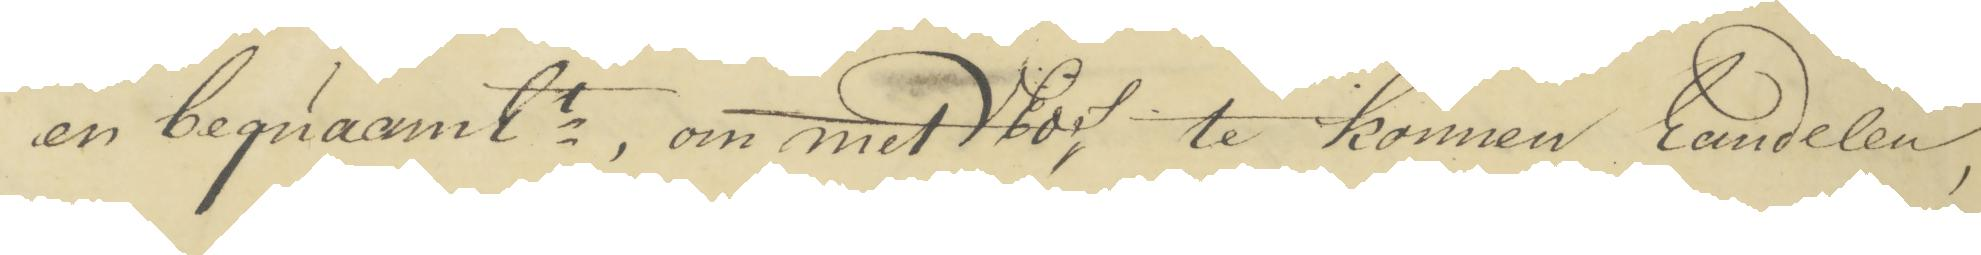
en bequaamh=t, om met VEd„s te konnen handelen,
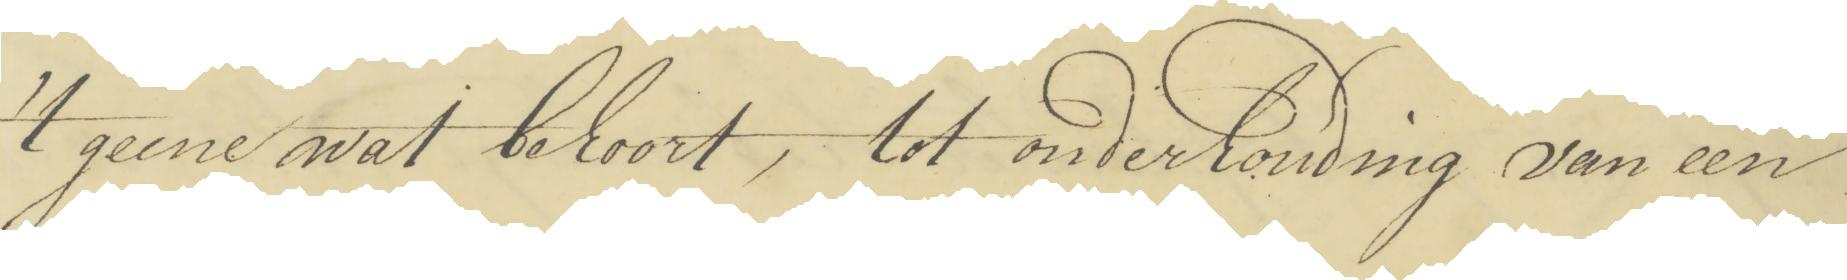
’t geene wat behoort, tot onderhouding van een
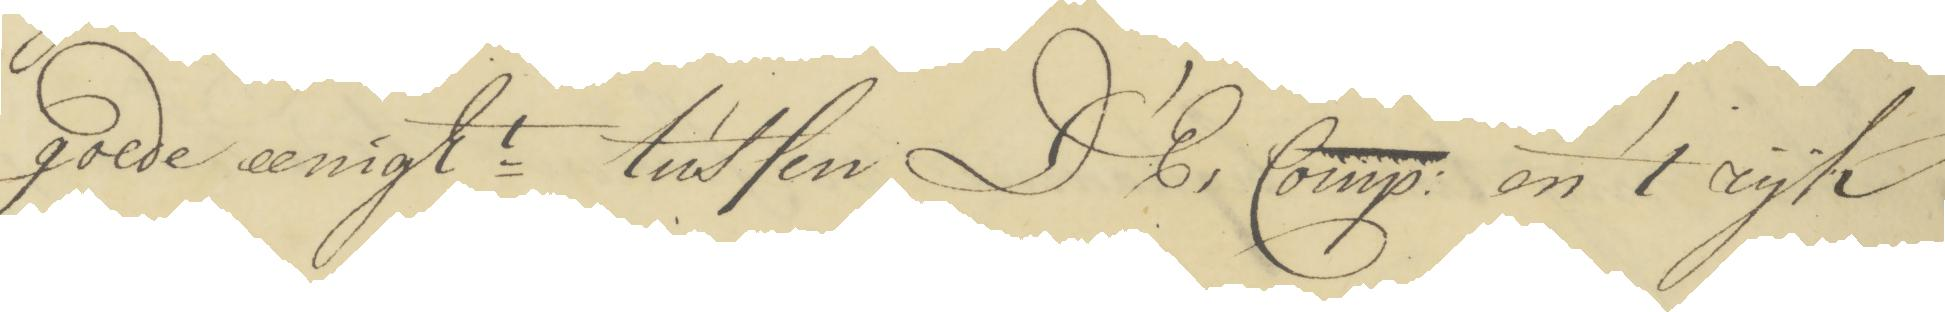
goede eenigh=t tussen D' E, Comp: en ’t rijk
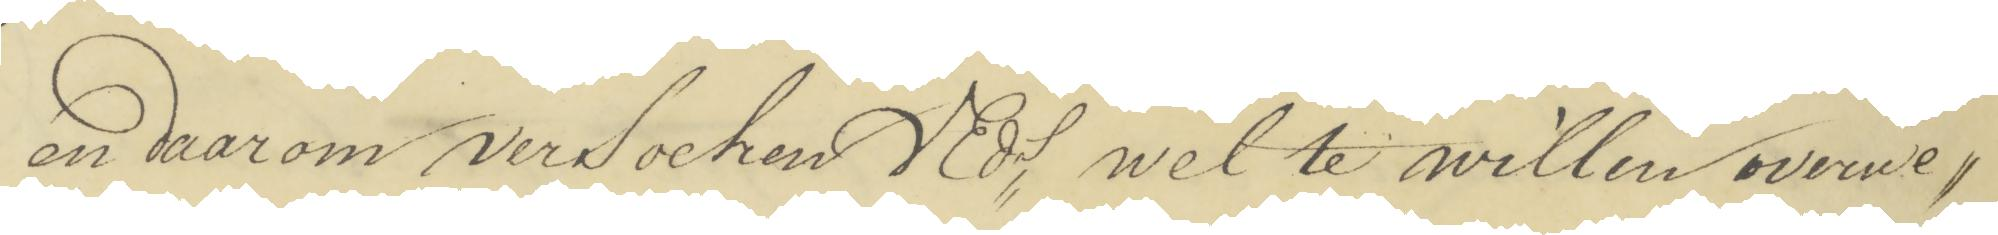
en daarom versoeken VEd„s wel te willen overwe„
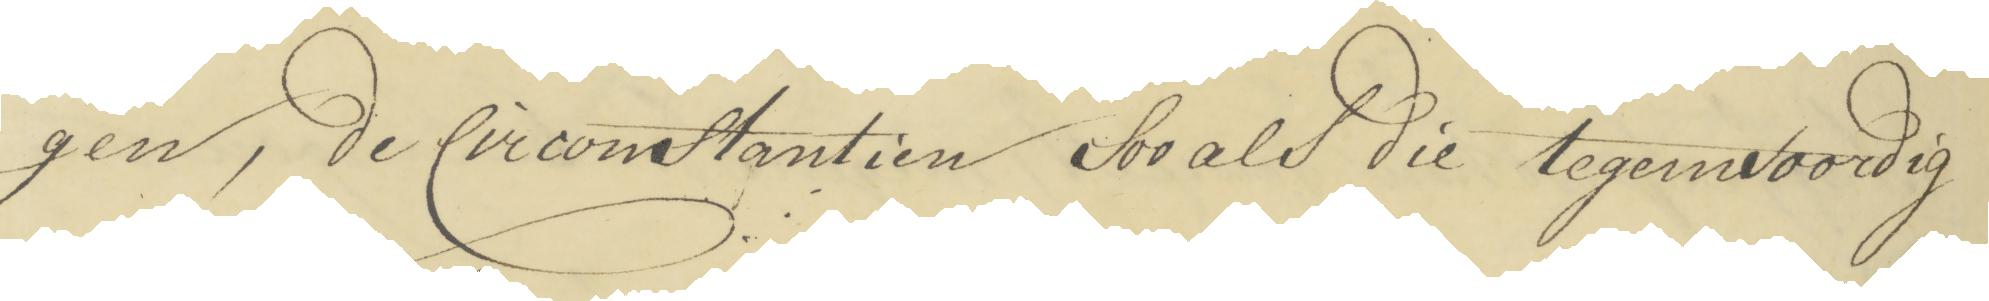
gen, de Circonstantien soo als die tegenwoordig
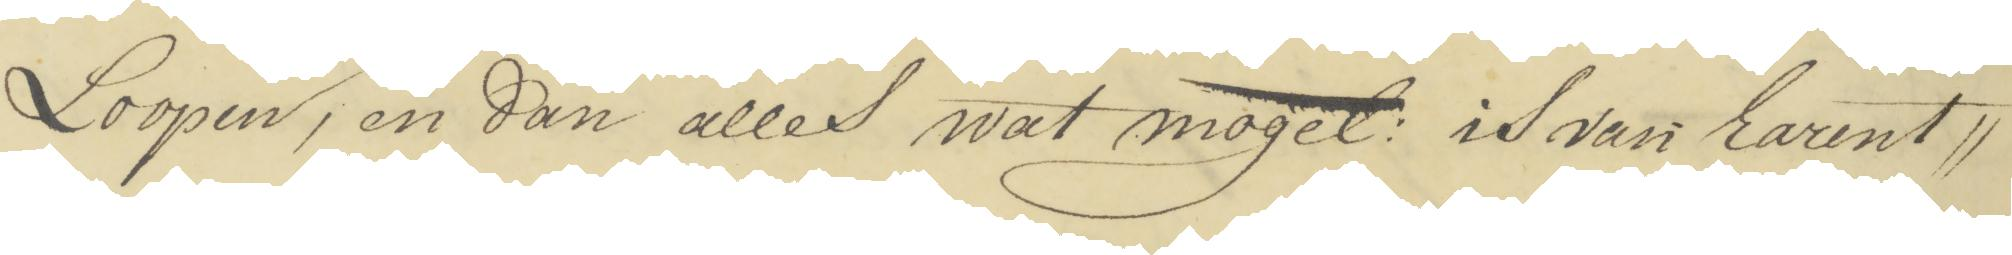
Loopen, en dan alles wat mogel: is van harent„
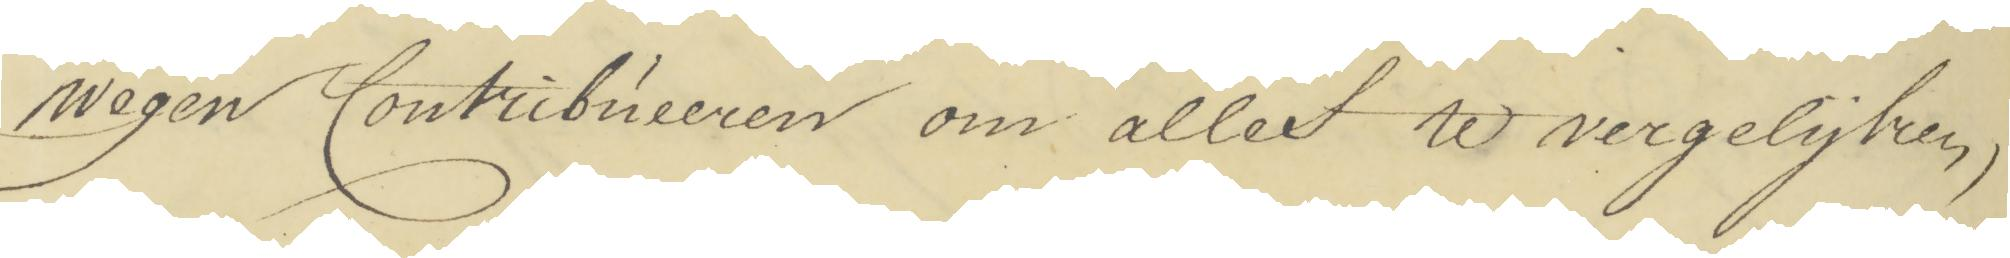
wegen Contribueeren om alles te vergelijken
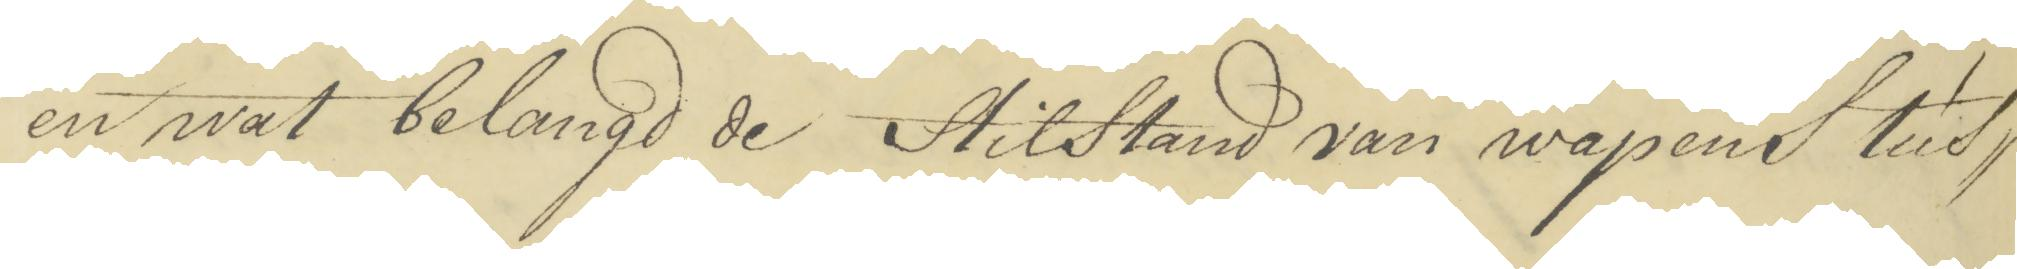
en wat belangd de stilstand van wapens tus„
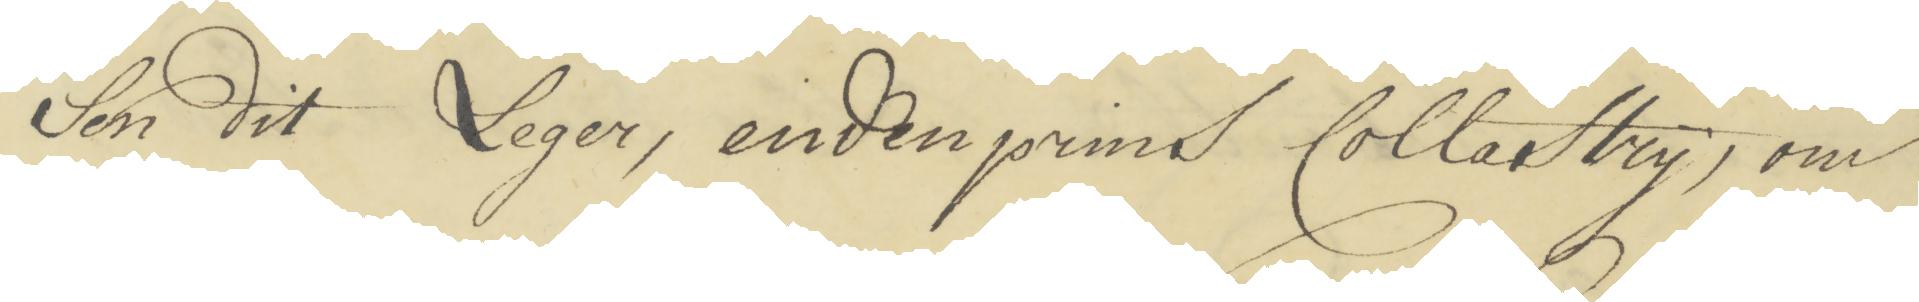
sen dit Leger, en den prins Collastrij, om
